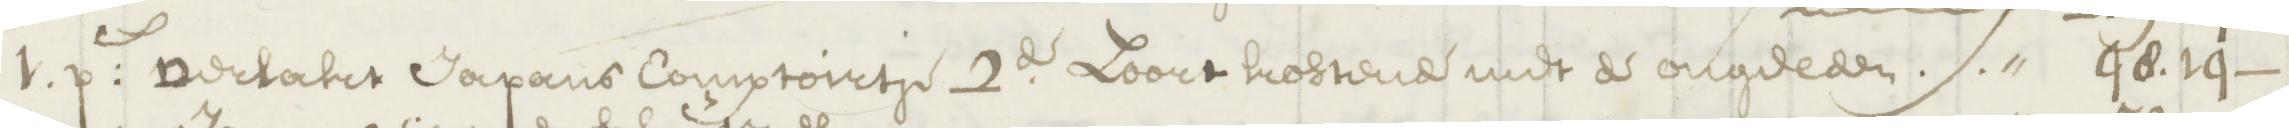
1. p:s verlakt Japans Comptoirtje 2.de Zoort kostende met de ongelden . . „ 48.14—
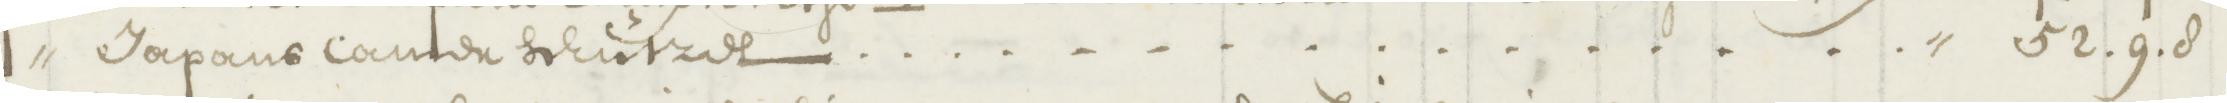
„ Japans camer schutzel - - - - - - - - - - - - - . „ 52.9.8.
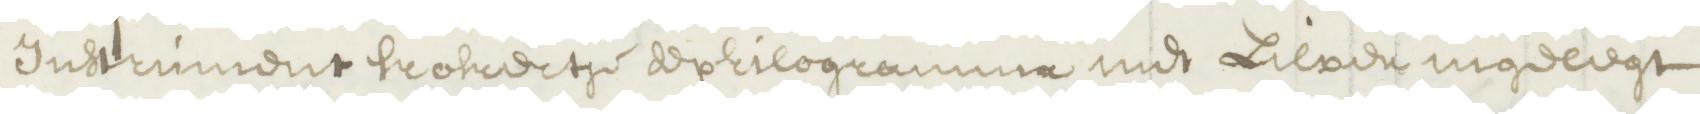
Instrument kokertje d ephilogramma met zilver ingelegt
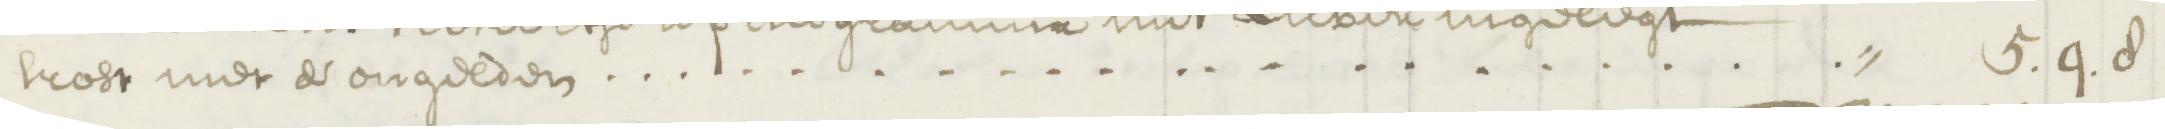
kost met de ongelden - - - - - - - - - - - - - - - - - - - . „ 5.9. 8
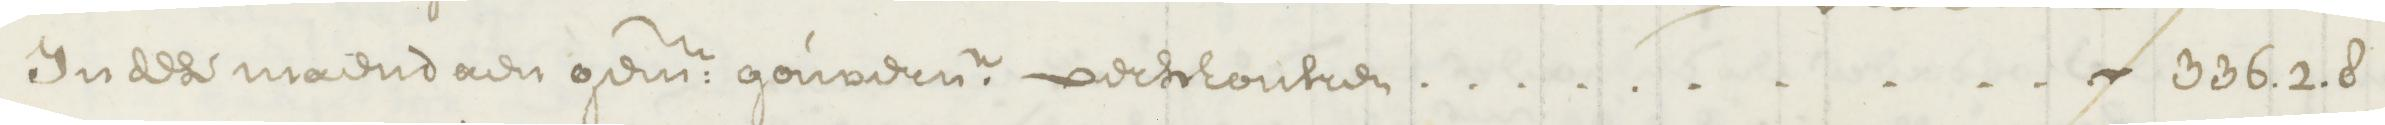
In dese maend aen gem: gouvern.r verschonken - - - - - - - - - - ƒ 336.2.8
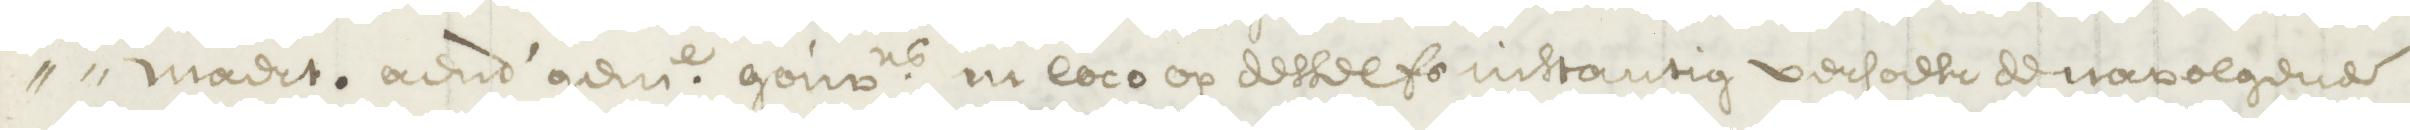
„ „ maert. aen d' gem.e gouv.rs in loco op desselfs instantig versoek de navolgende
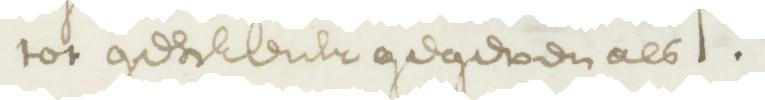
tot geschenk gegeven als.
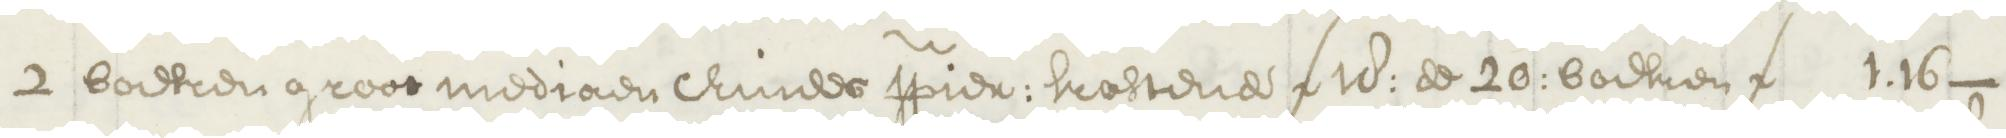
2 boeken groot mediaen Chinees ppier: kostende ƒ 18: de 20: boeken ƒ 1.16—
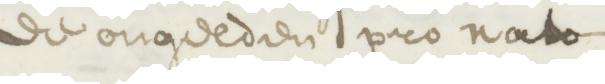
De ongelden pro rato
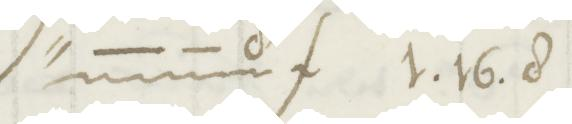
„ — — 8 ƒ 1: 16. 8
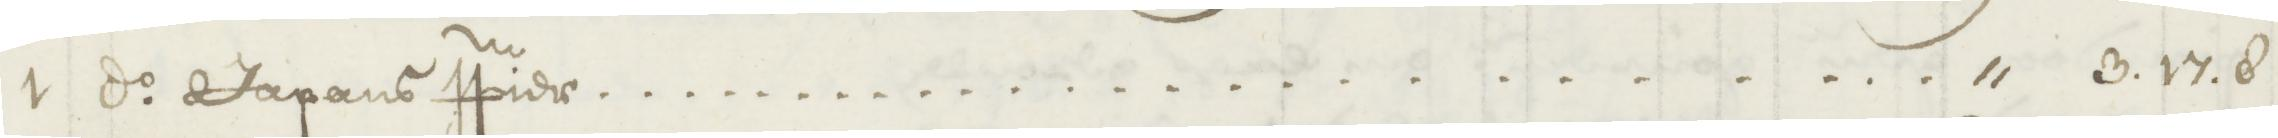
1 d.o Iapans ppier - - - - - - - - - - - - - - - - - - - - „ 3. 17. 8
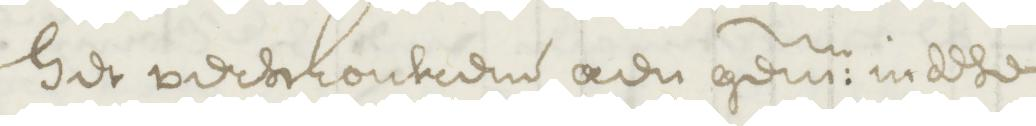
het verschonkene aen gem: in dese
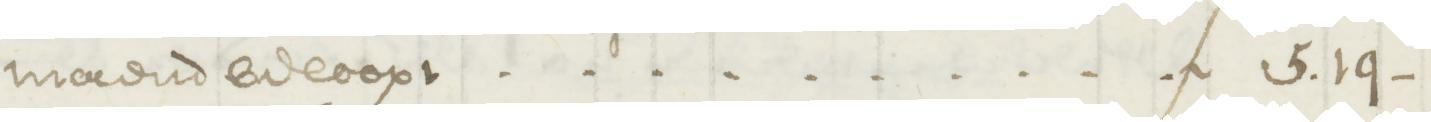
maend beloopt - - - - - - - - - ƒ 5.14 -
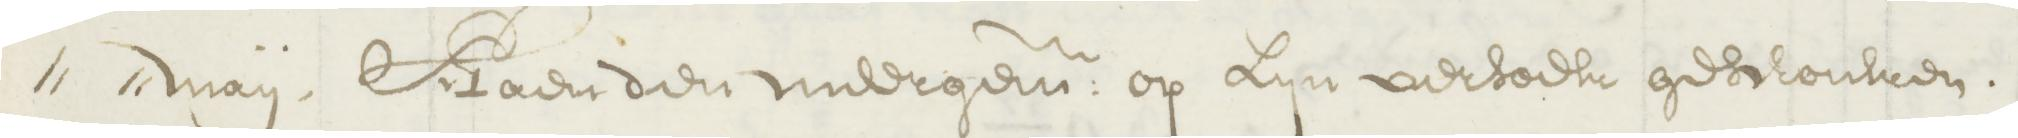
„ „ maij, Aaen den meergem: op zyn versoek geschonken.
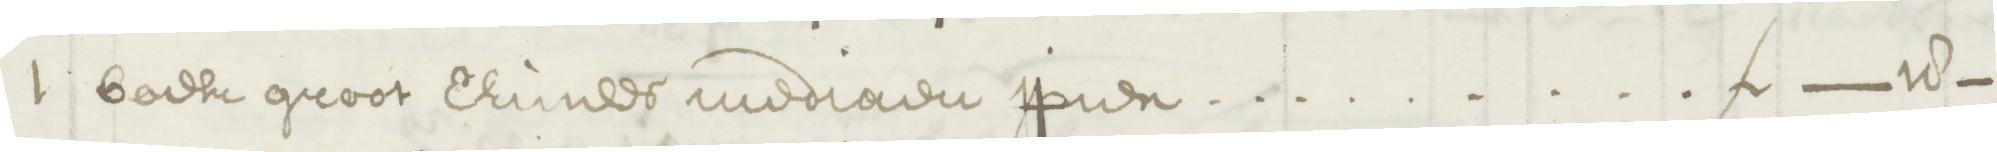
1 boek groot Chinees mediaen ppier - - - - - - - -ƒ —18—
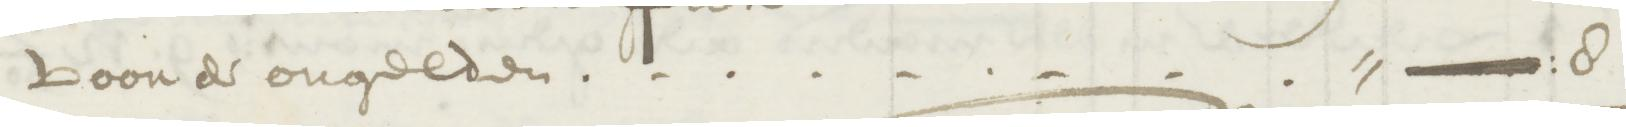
voor de ongelden - - - - - - - - „ —:8
